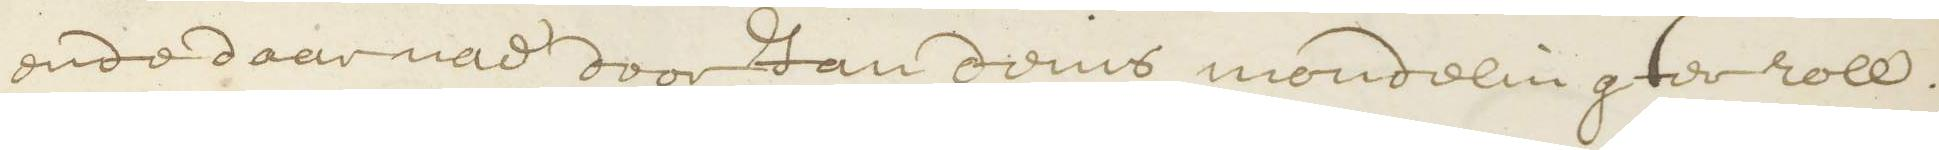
ende daarnae door Jan denis mondeling ter roll.
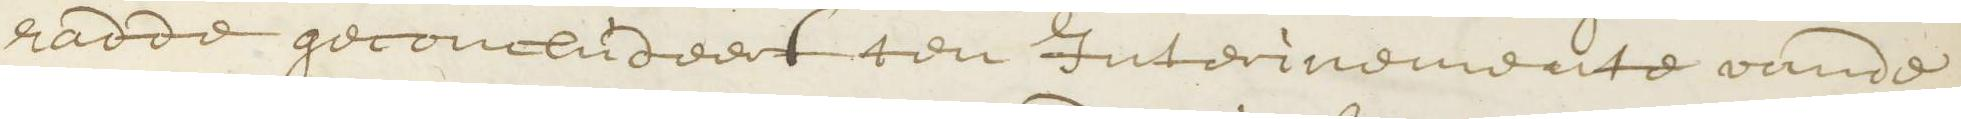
hadde geconcludeert ten Interinemente vande
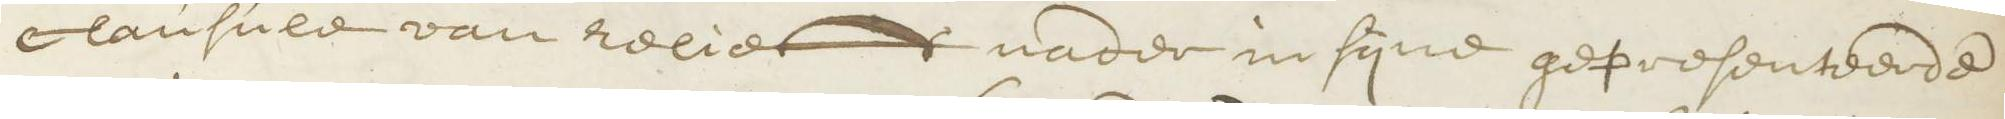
clausule van relieff nader in sijne gepresenteerde
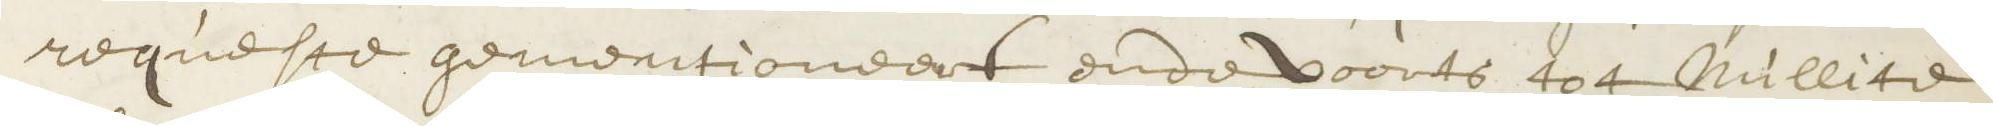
requeste gementioneert ende voorts tot millite
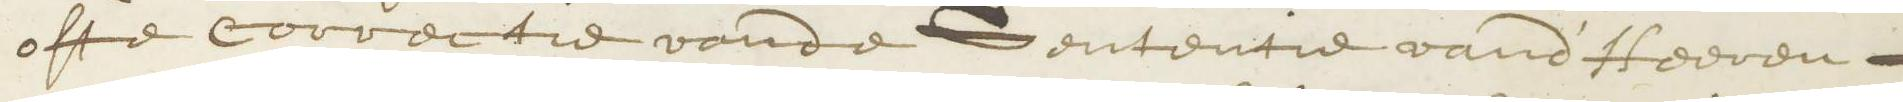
ofte correctie vande Sententie vand’ Heeren
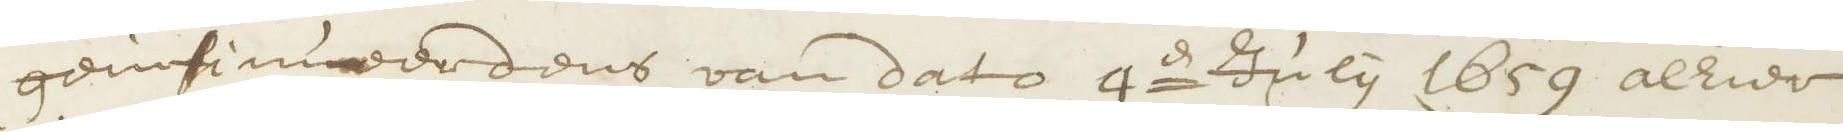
geinsinueerdens van dato 4=en Iulij 1659 alhier
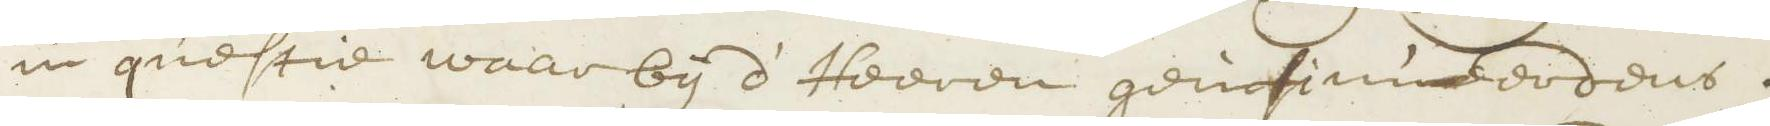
in questie waarbij d’ Heeren geinsinueerdens
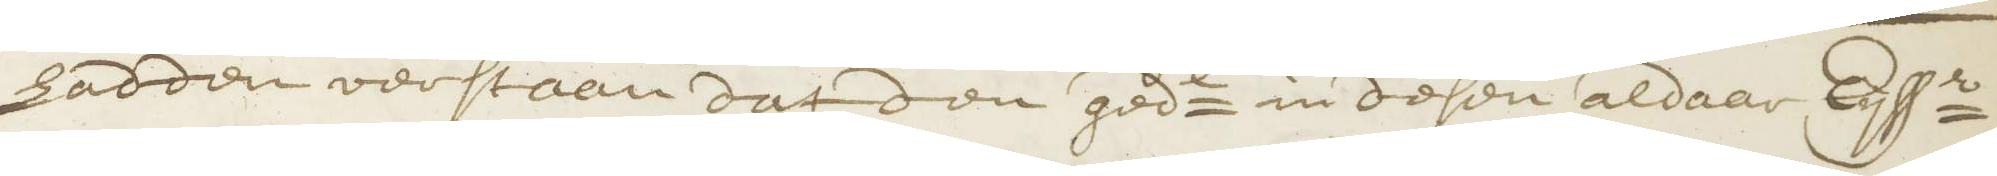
hadden verstaan dat den ged=e in desen aldaar Eijss=r
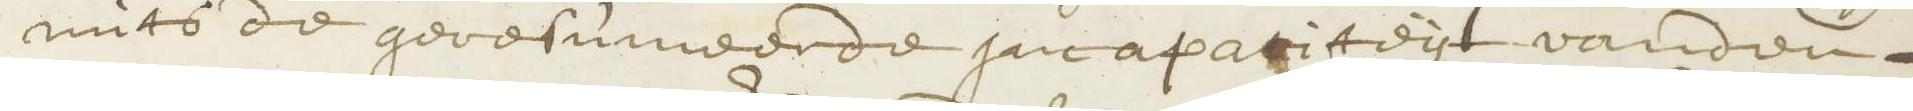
mits de geresumeerde jncapatiteijt vanden
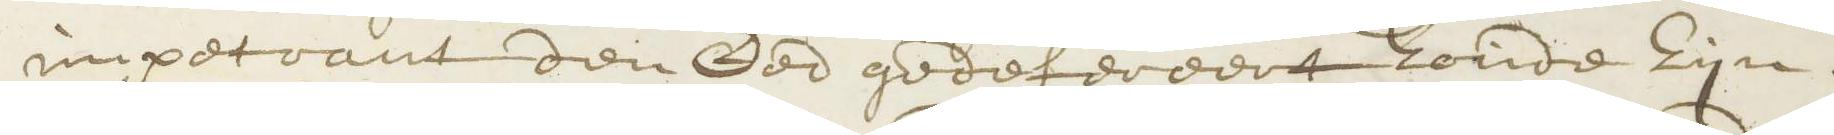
impetrant den Eed gedefereert zoude zijn
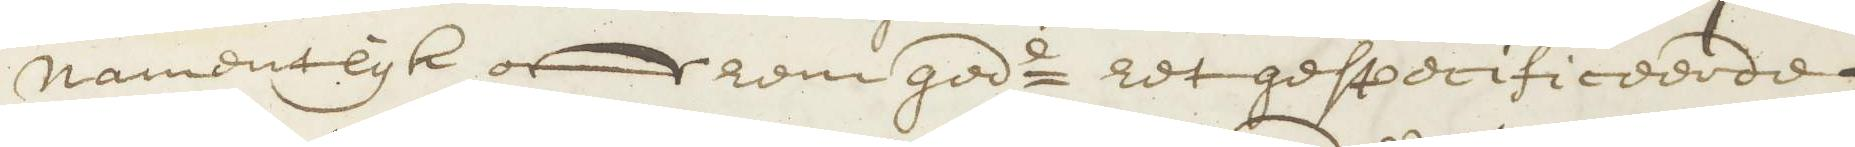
namentlijk off hem ged=e het gespecificeerde
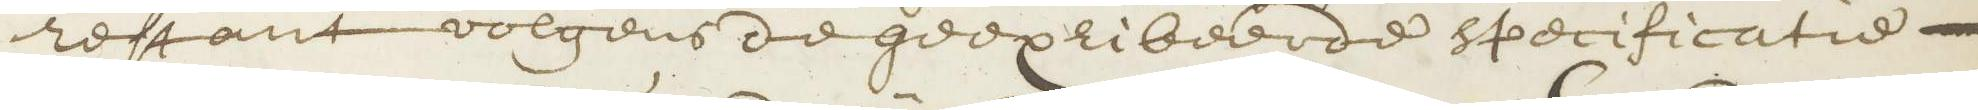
restant volgens de geexhibeerde specificatie
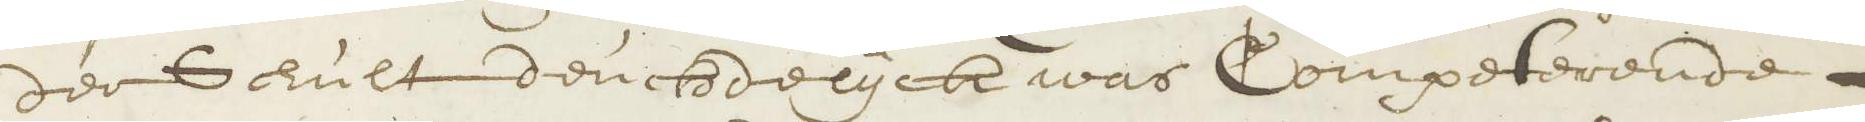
der schult deuchdelijck was Competerende
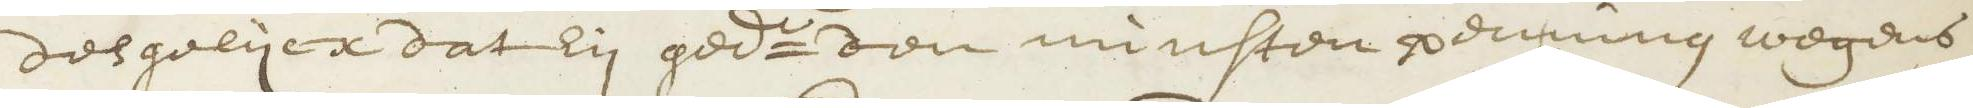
desgelijcx dat hij ged=e den minsten penning wegens
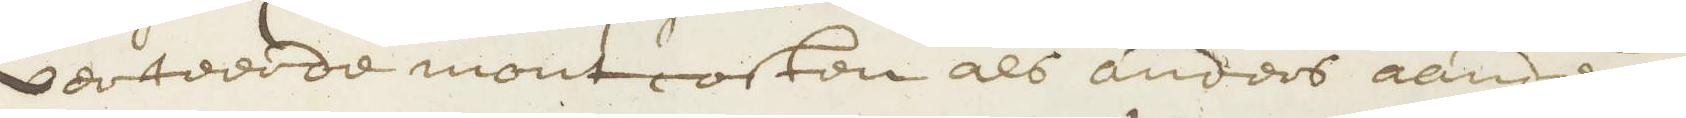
verteerde montcosten als anders aanden
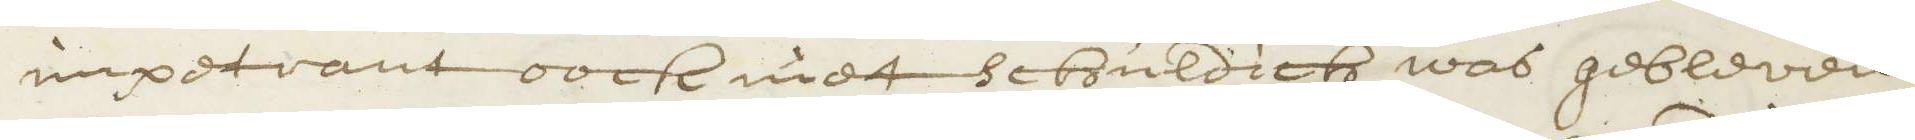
impetrant oock niet schuldich was gebleven
